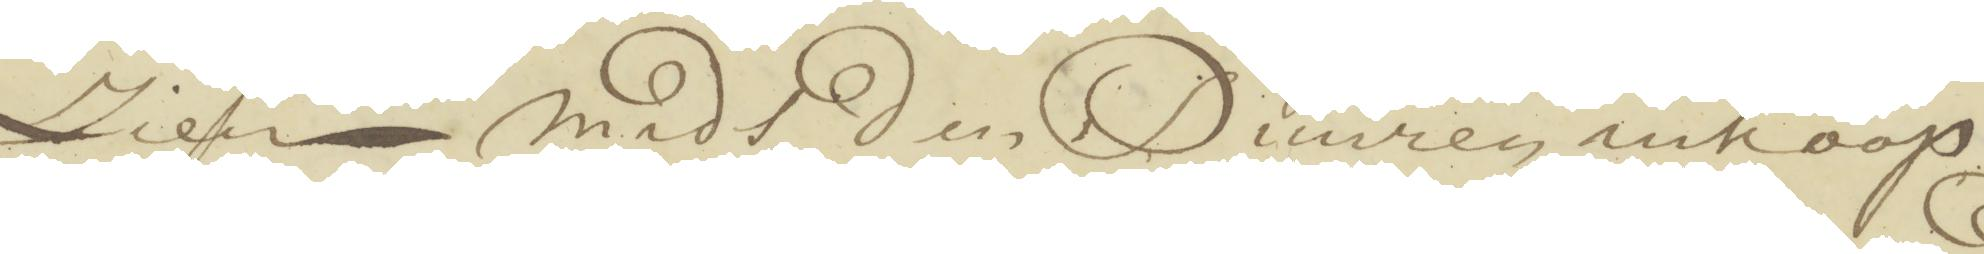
zien mids den Duuren inkoop
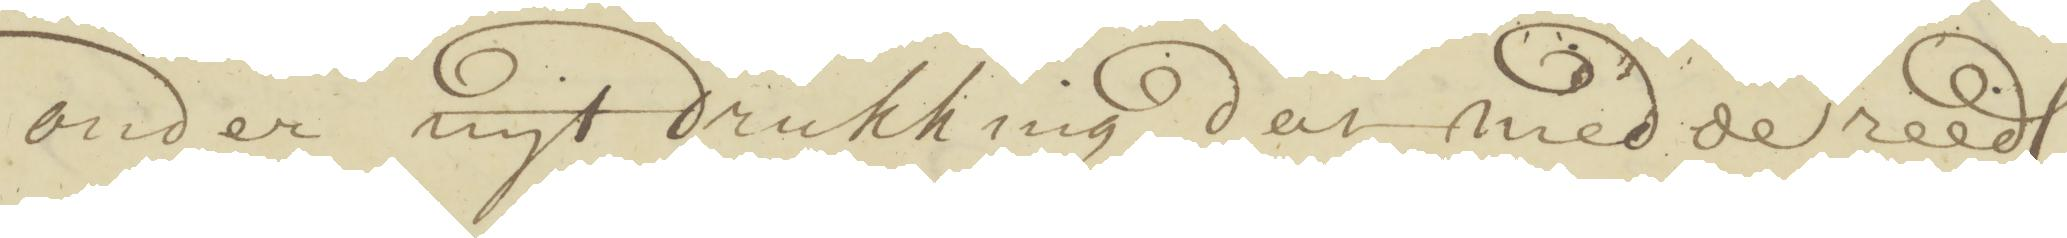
onder uijt drukking dat med de reeds
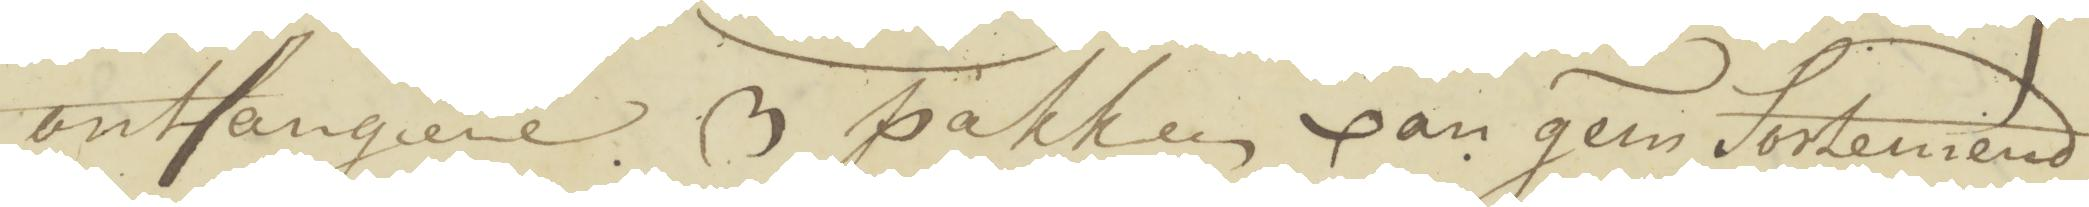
ontfangene 3 pakken van gem sortemend,
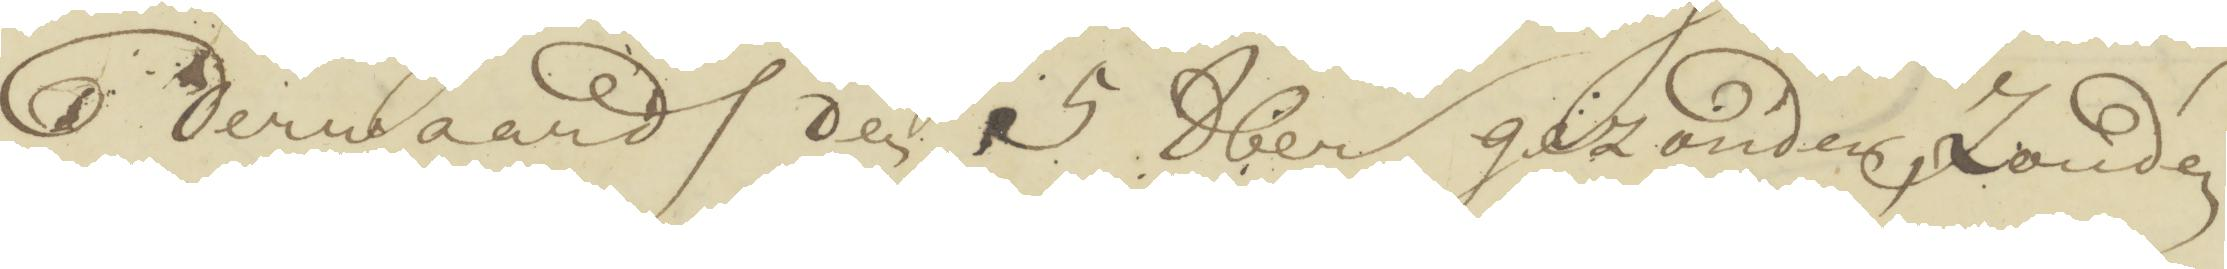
derwaards den 5 8ber gezonden, zouden
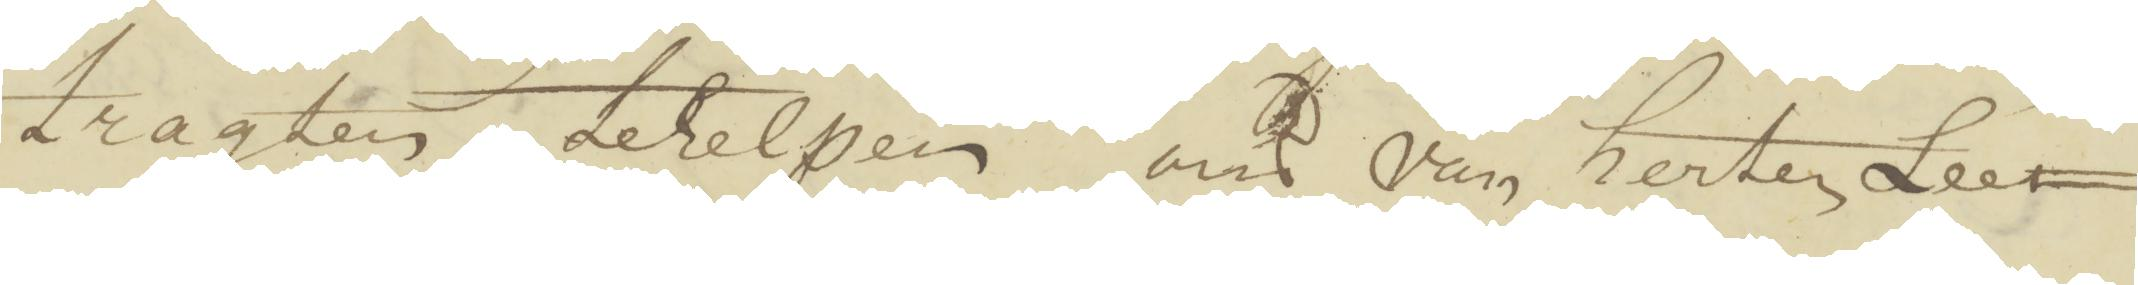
tragten tehelpen ons van herten Leet
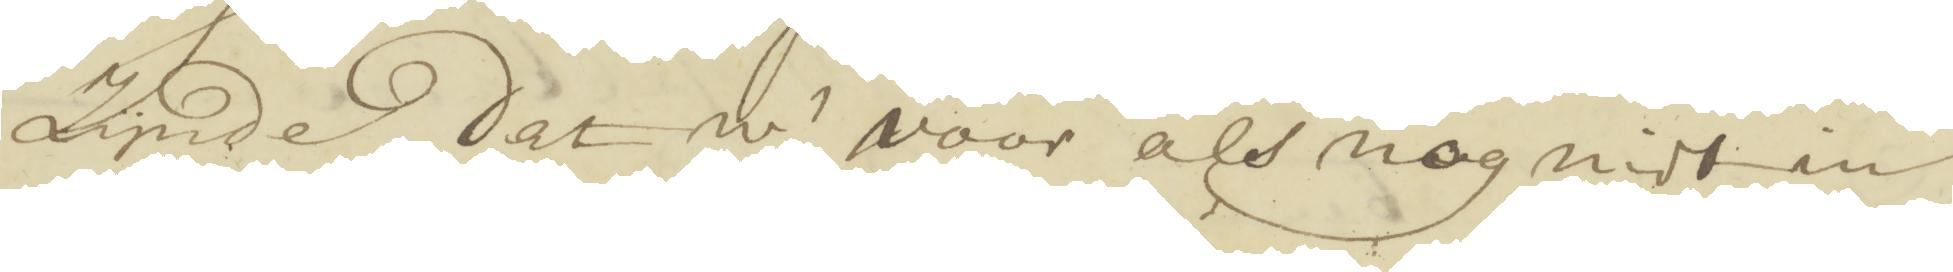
zijnde dat w' voor als nog niet in
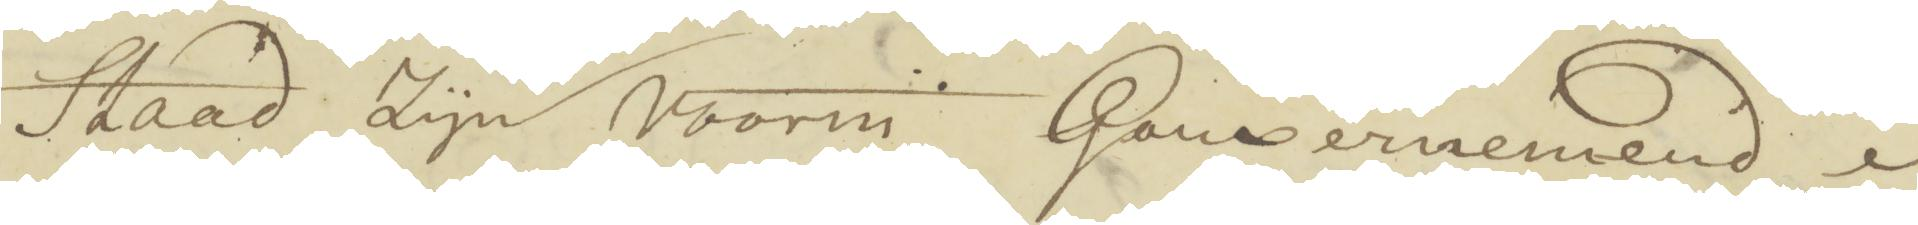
staad zijn voorm Gouvernemend en
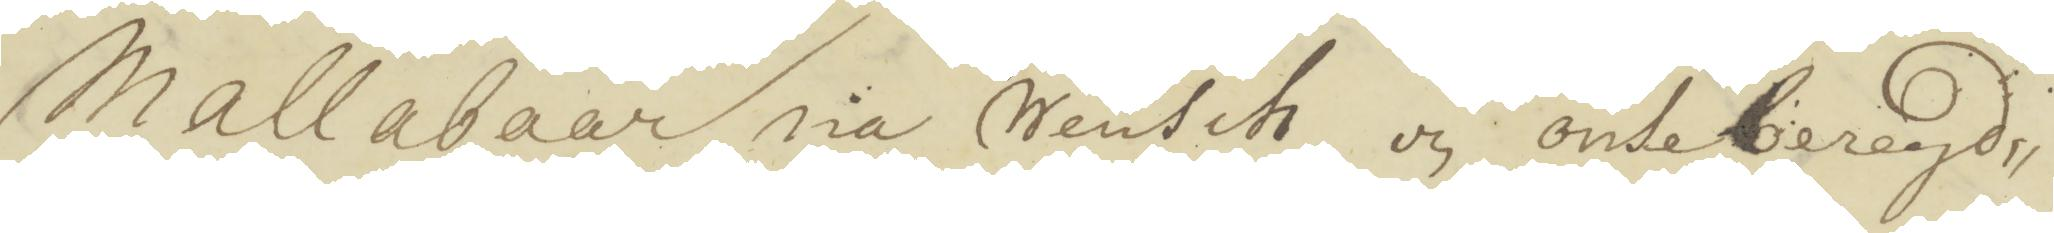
Mallabaar na wensch en onse bereyd„
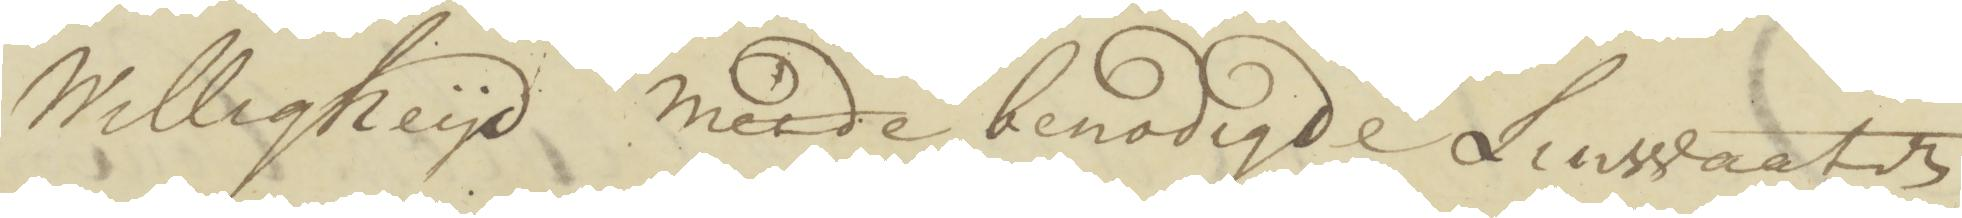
willigheijd met de benodigde Linwaaten
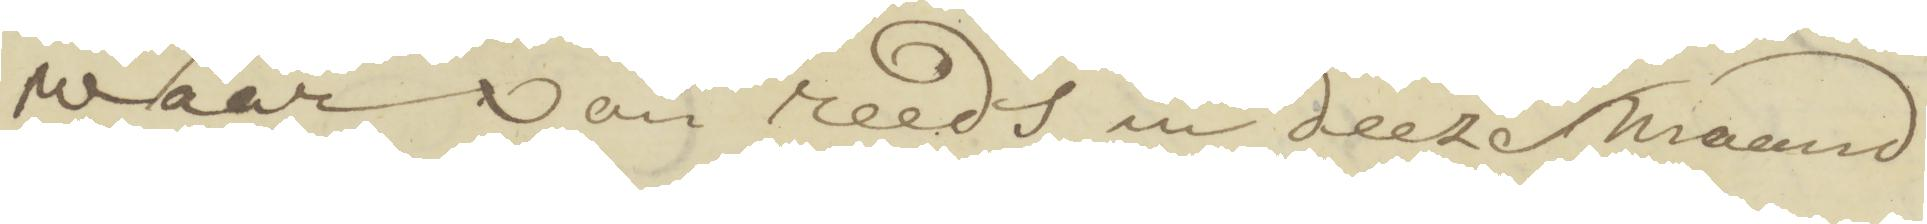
waar van reeds in deeze maand
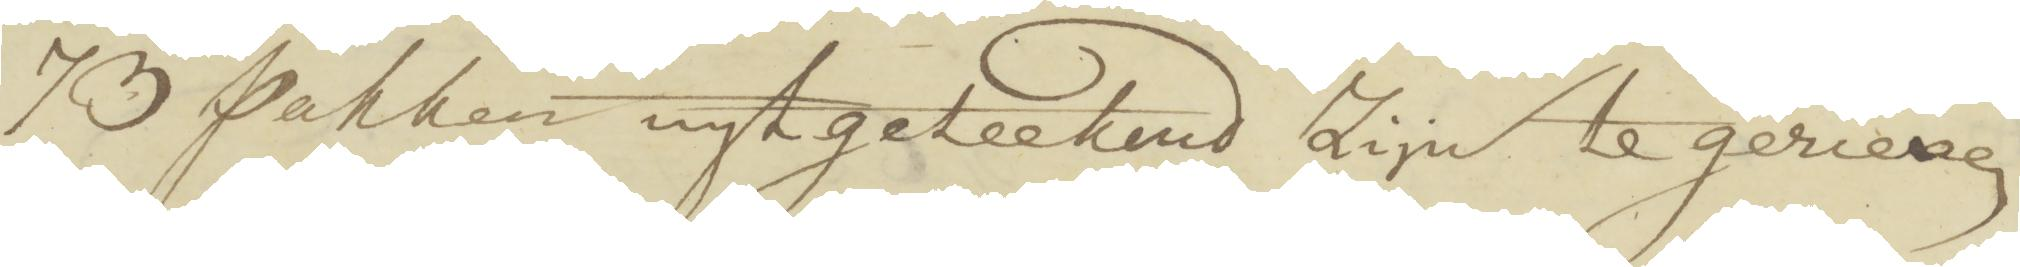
73 pakken uytgeteekend zijn te gerieven
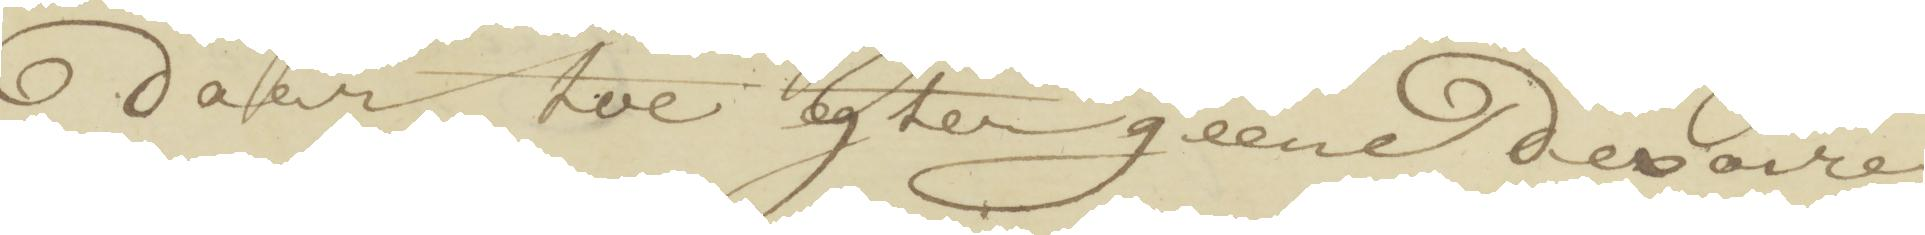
daar toe egter geene devoiren
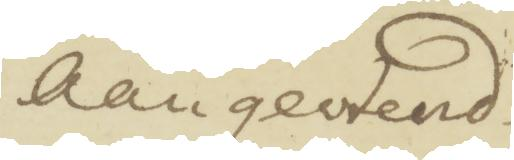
aangewend
